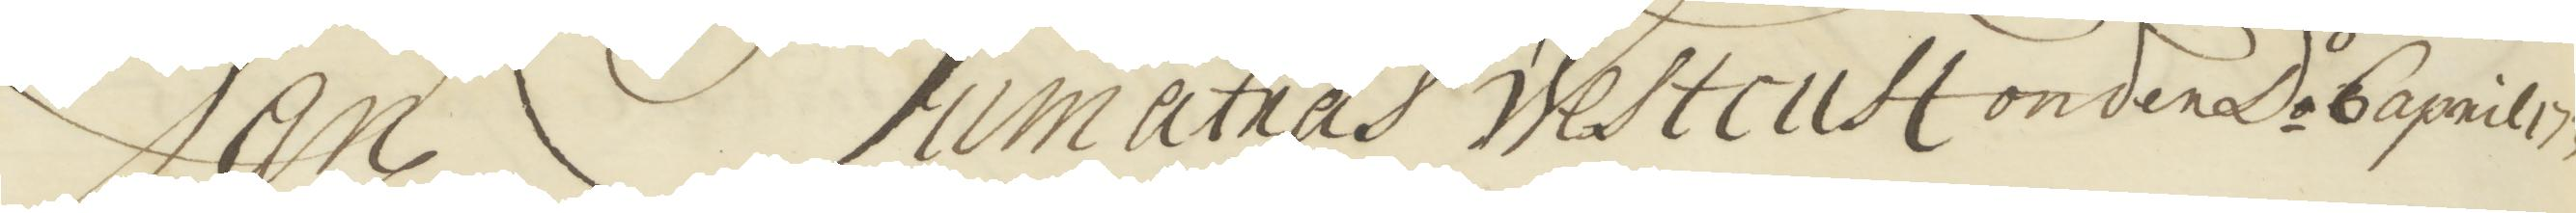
Van Sumatras westcust onder D=o 6 april 17
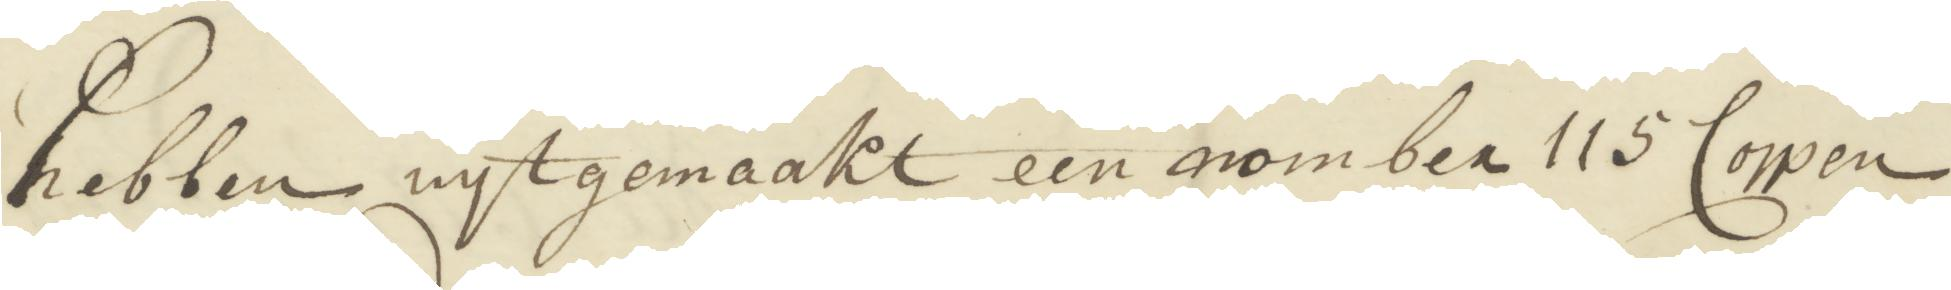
hebben uytgemaakt een nomber 115 Coppen
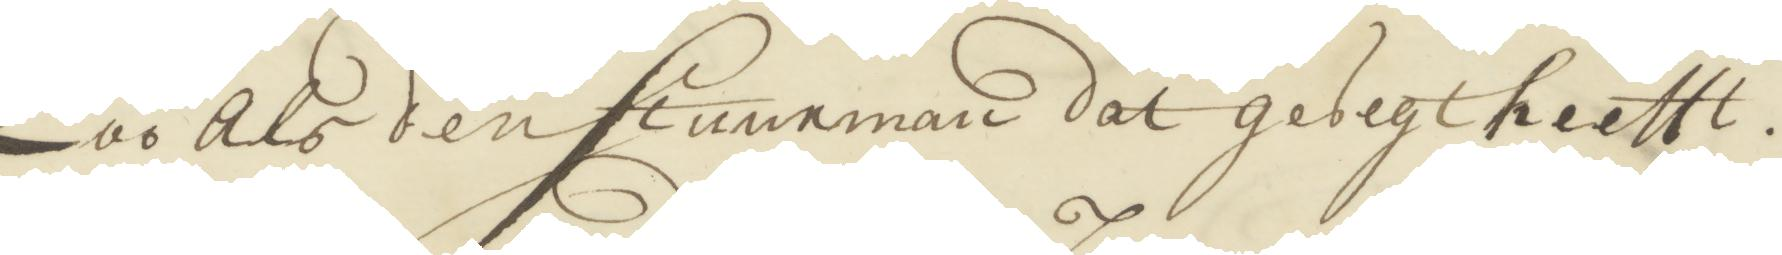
Zoo Als den Stuurman dat gesegt heefft.
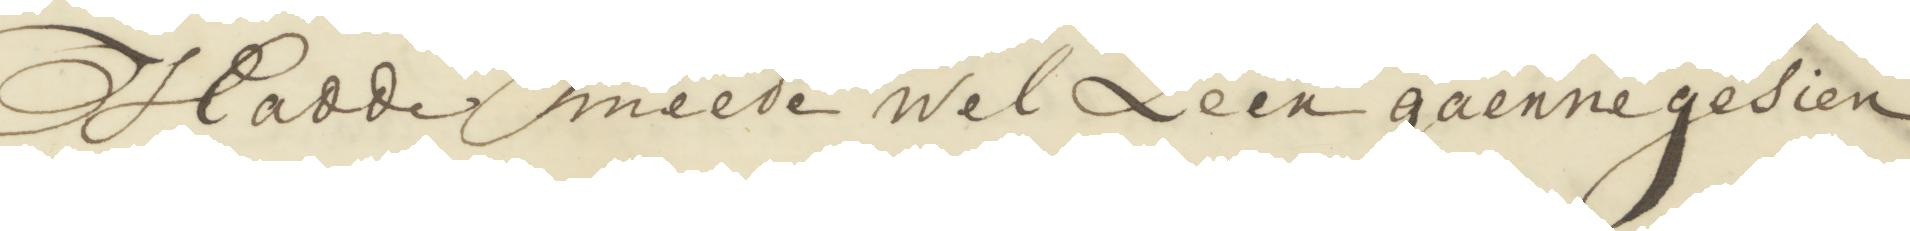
Hadde meede wel Zeer gaerne gesien
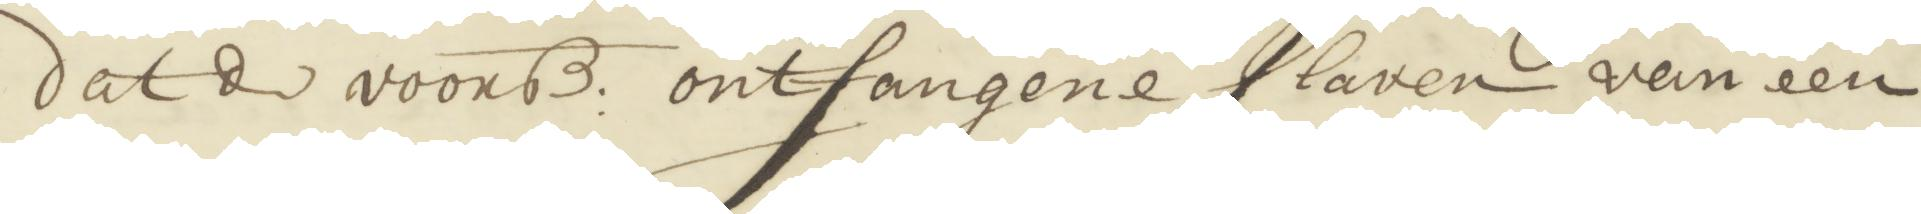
dat de voors: ontfangene slaven van een
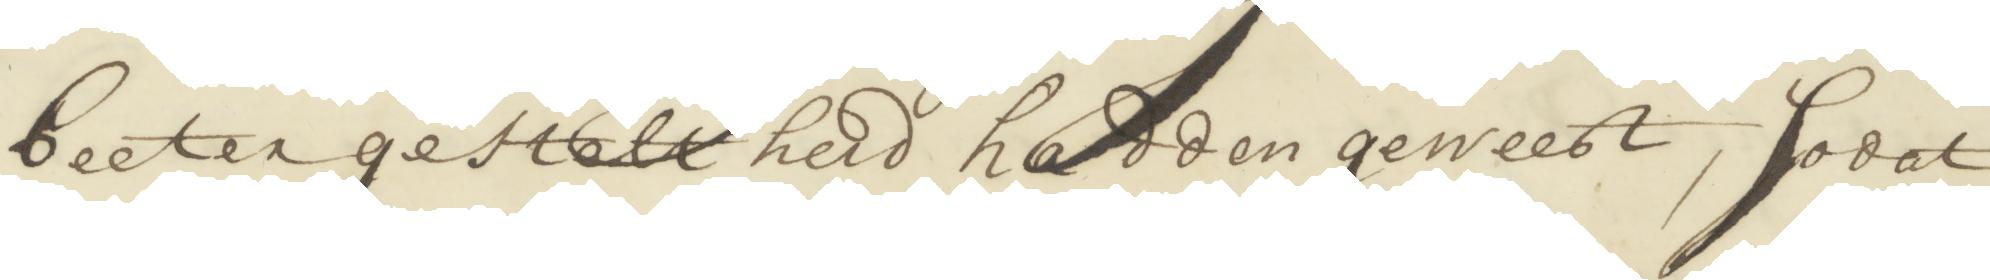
beeter gesteltheid hadden geweest, sodat
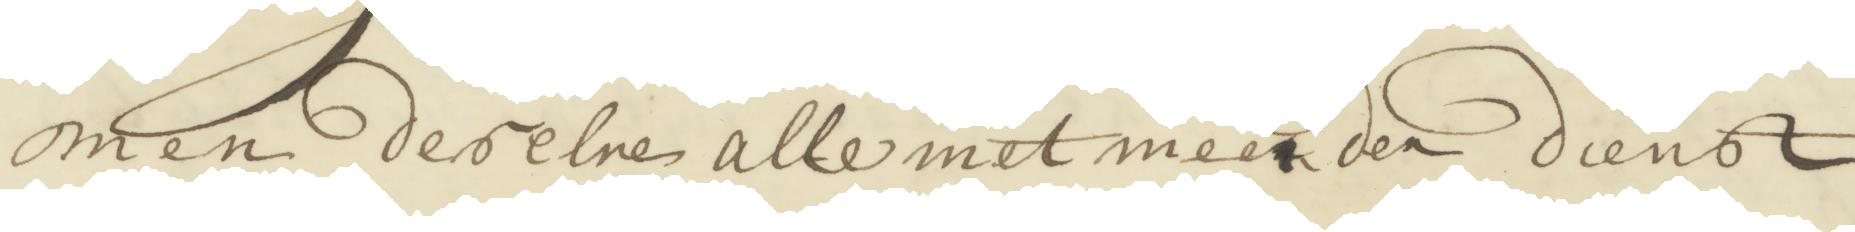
om en deselve alle met meerder dienst
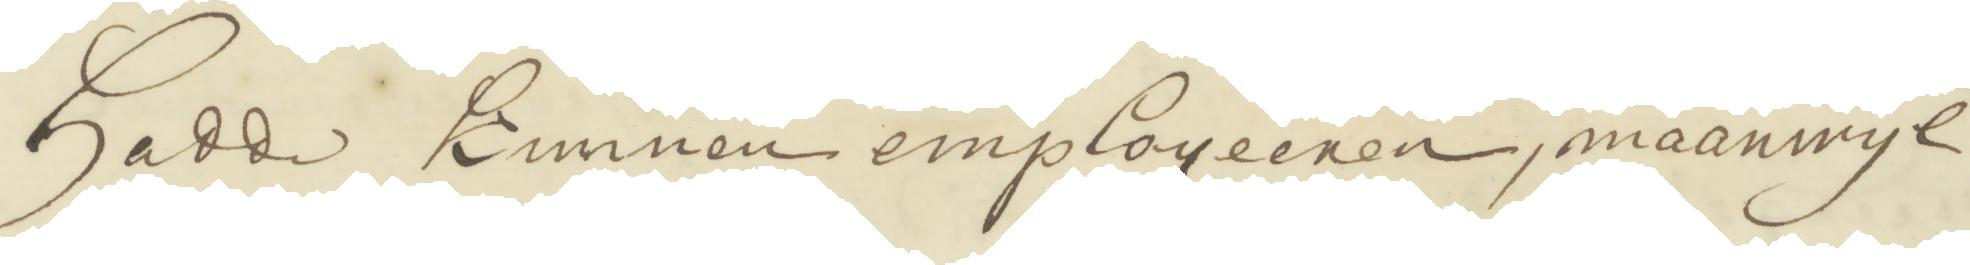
hadde kunnen employeeren, maar wyl
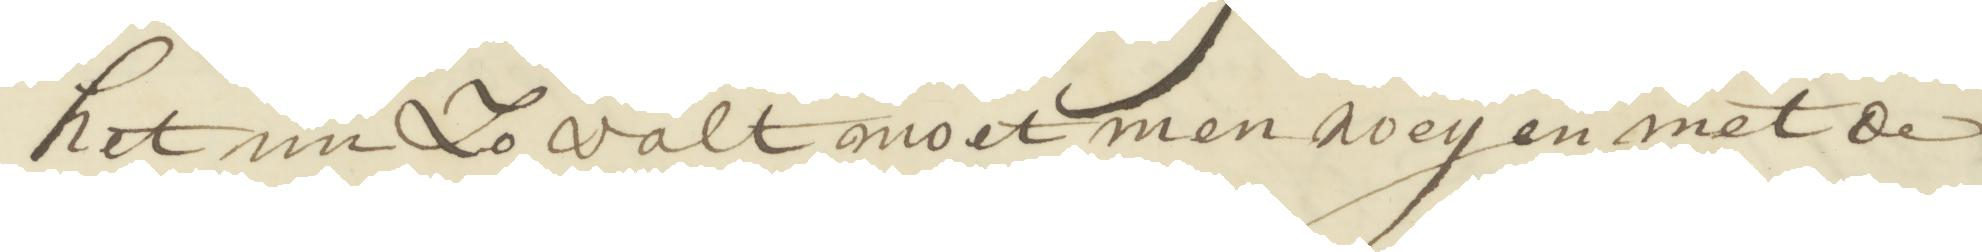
het nu Zo valt moet men roeyen met de
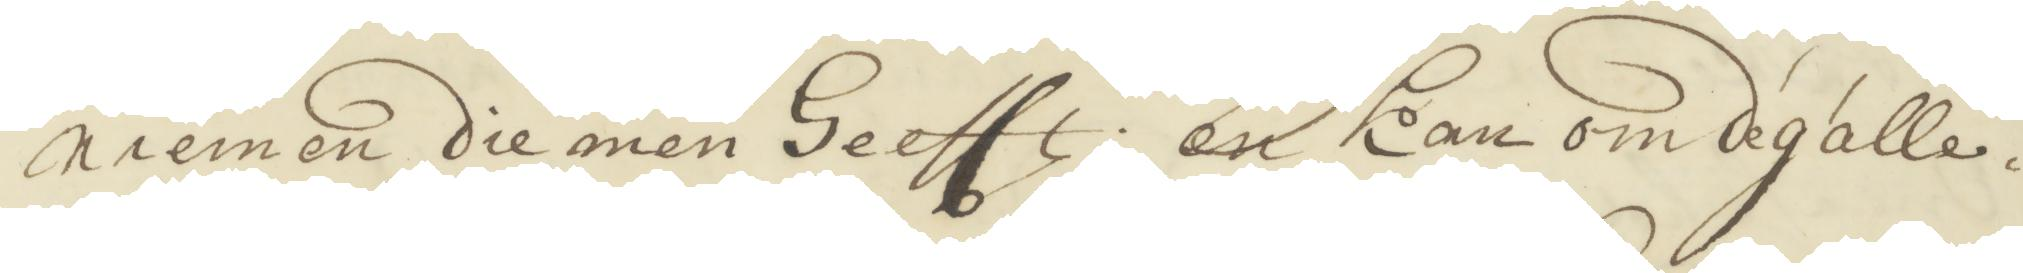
riemen die men heefft; en kan om de'g'alle„
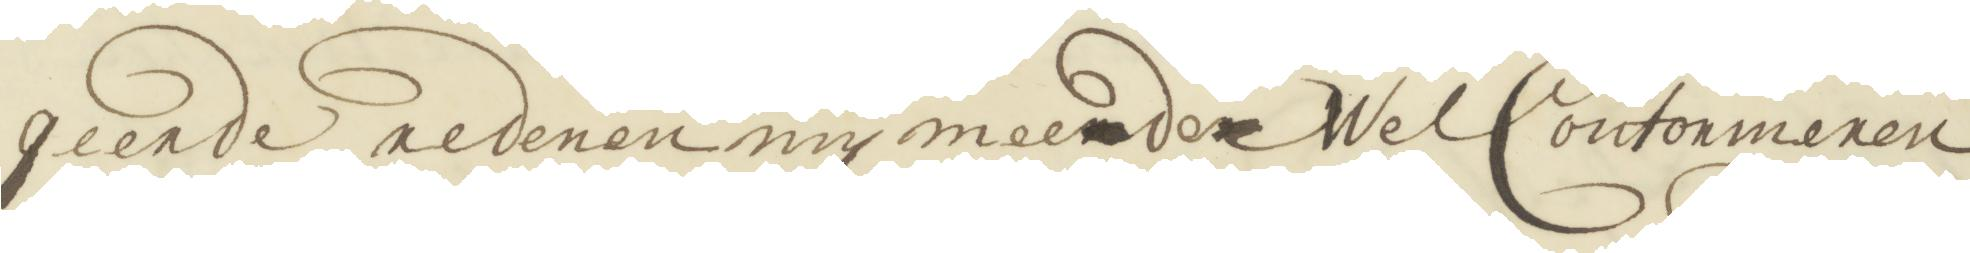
geerde redenen my meerder wel Contormeren
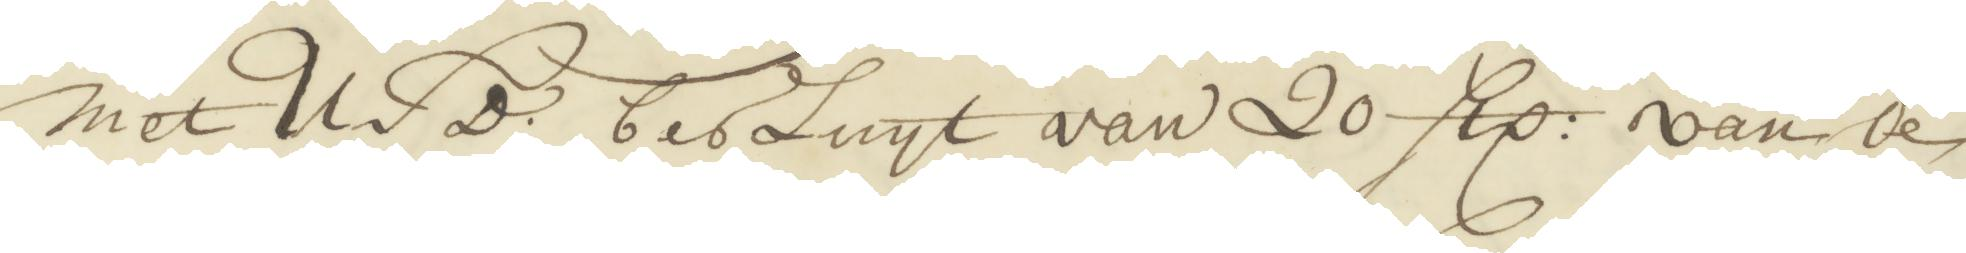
met uE e: besluyt van 20 stx: van de
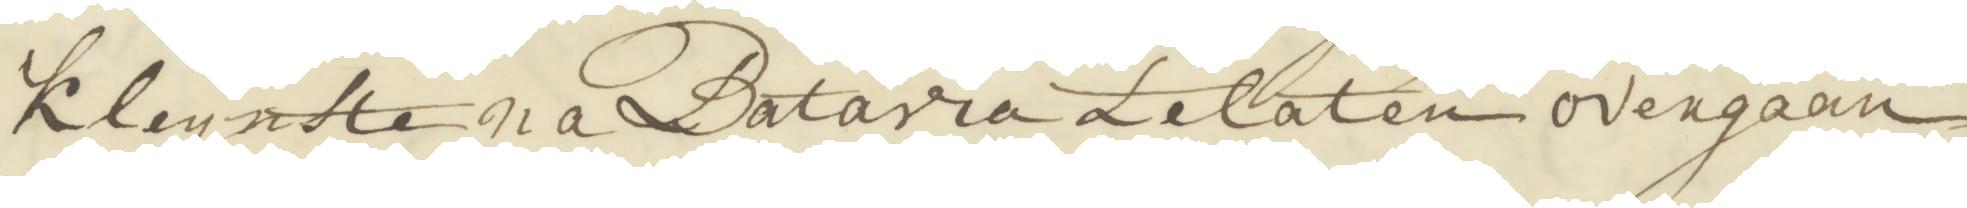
kleynste na Batavia telaten overgaan,
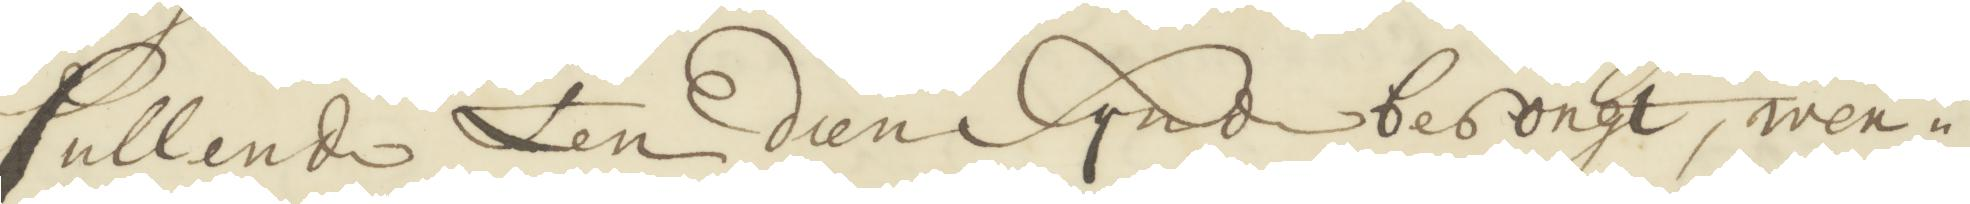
sullende ten dien Eynde besorgt, wer„
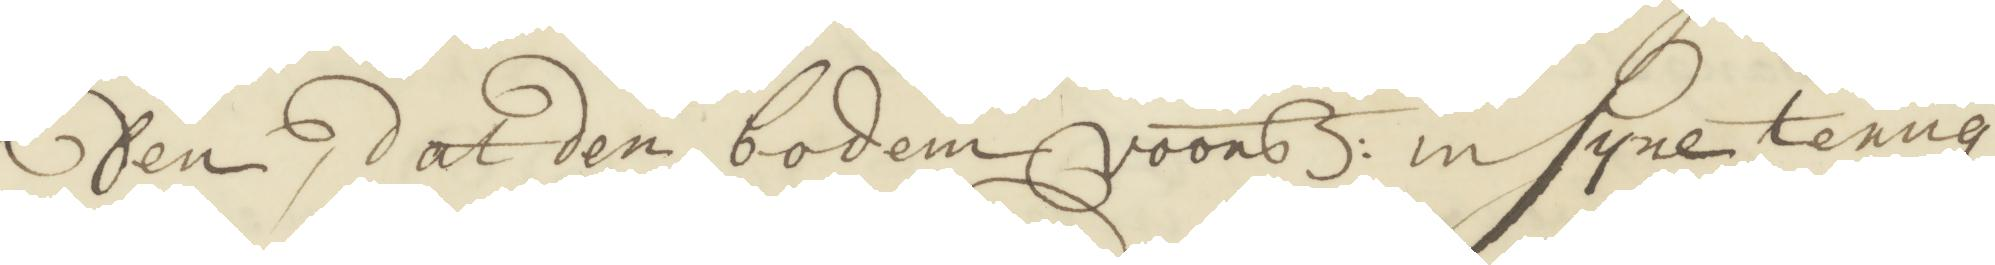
den, dat den bodem voorsz: in syne terug
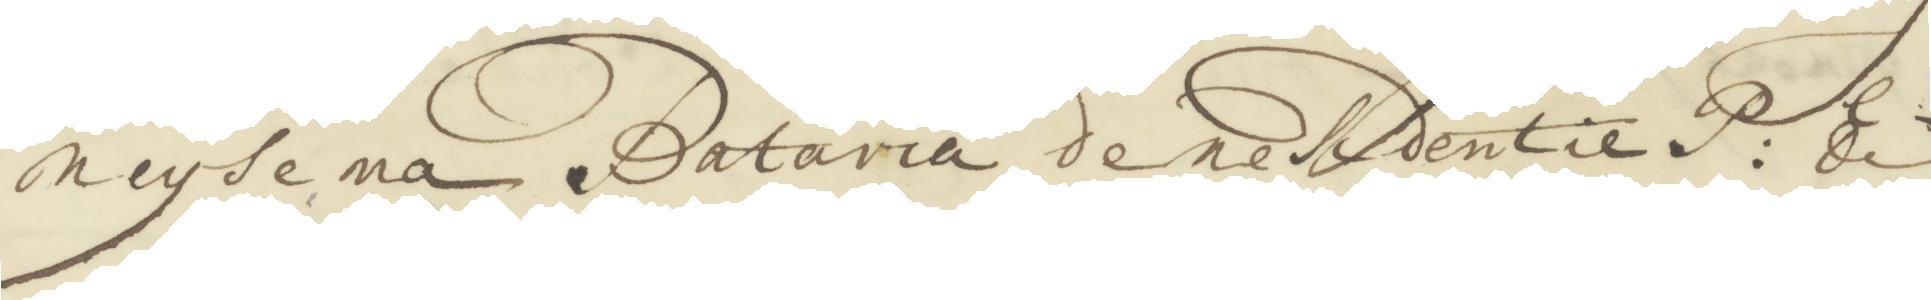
reyse na Batavia de residentie P: l de
